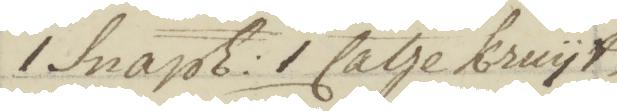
1 snaph: 1 Catje kruijt
